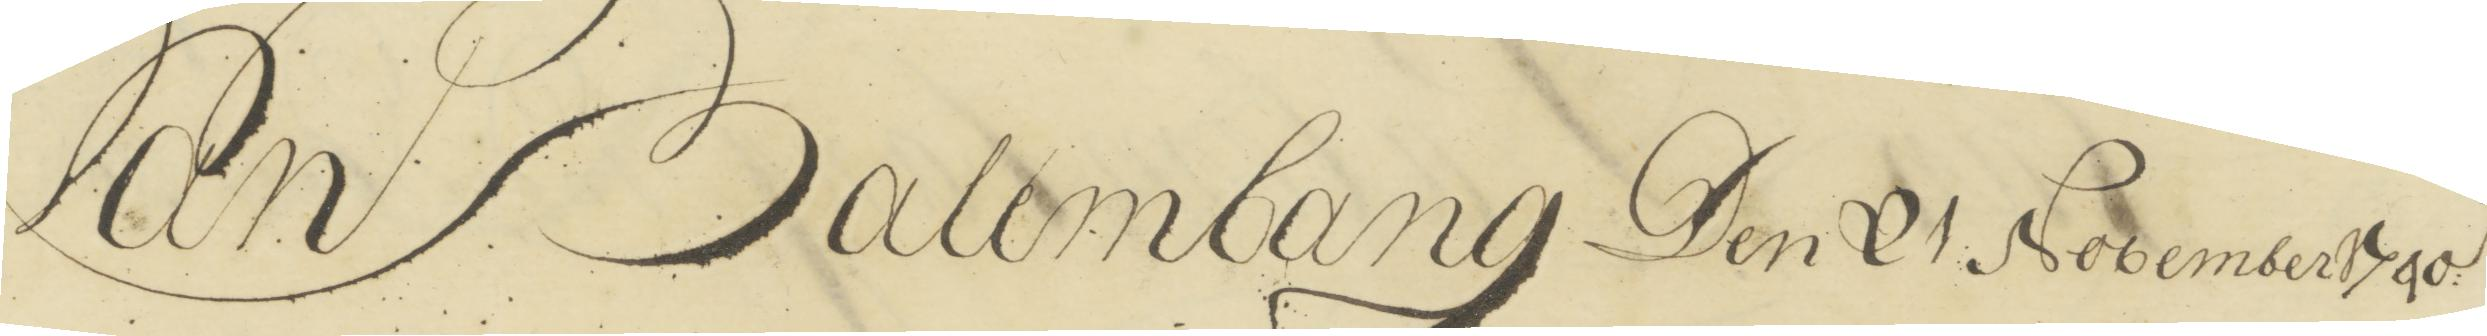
Van Palembang Den 21 November 1740:
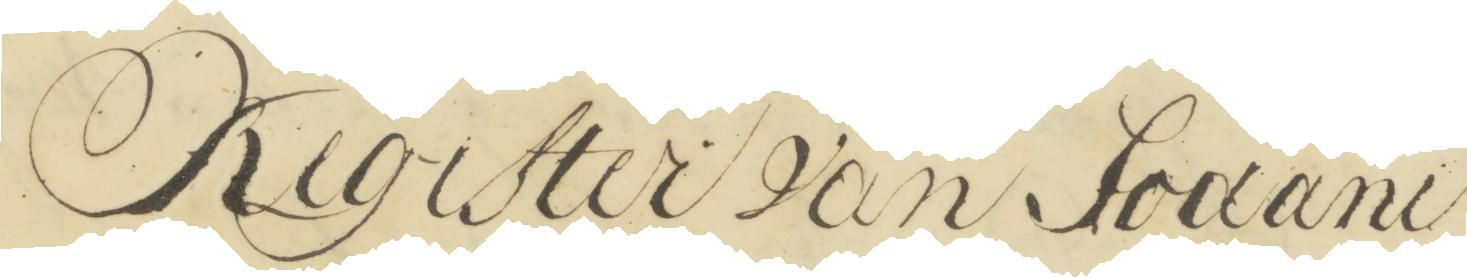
Register van sodani
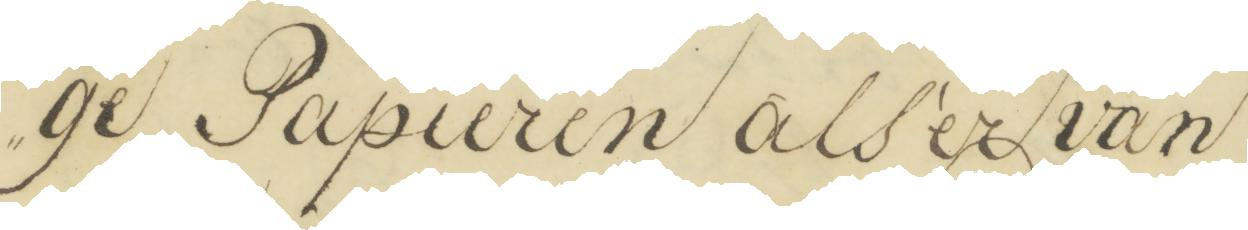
„ge Papieren als 'er van
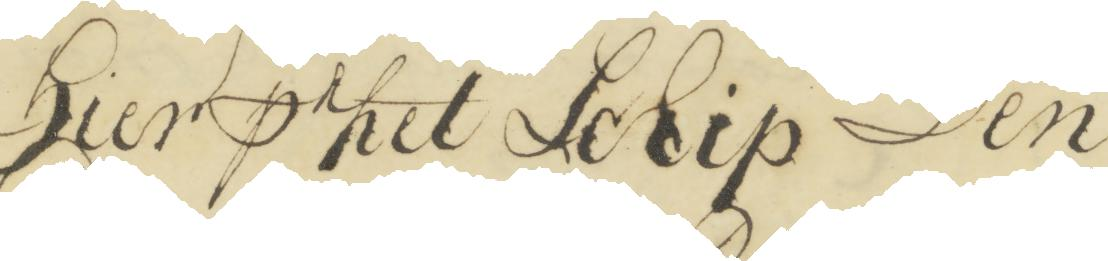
hier pr het schip Den
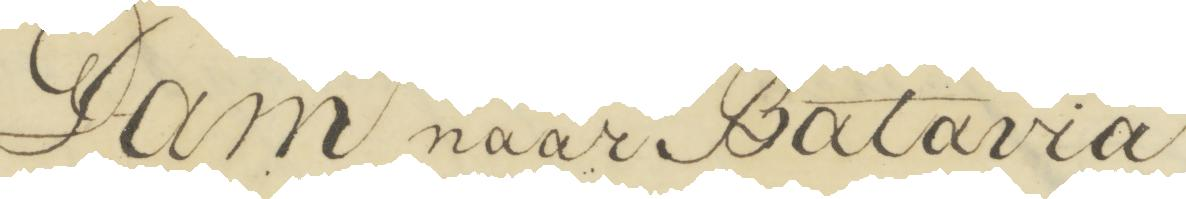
Dam naar Batavia
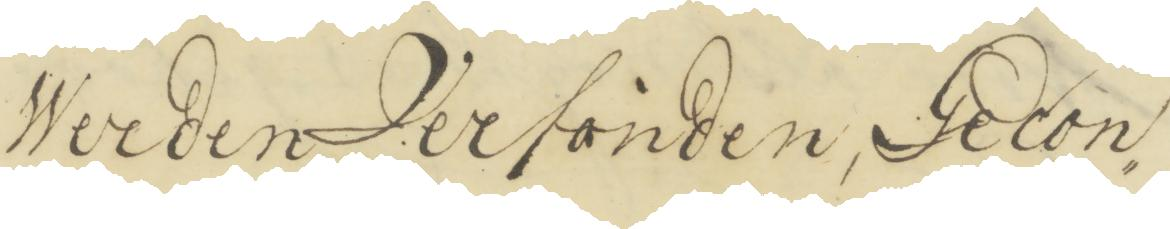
Werden Versonden, Gecon„
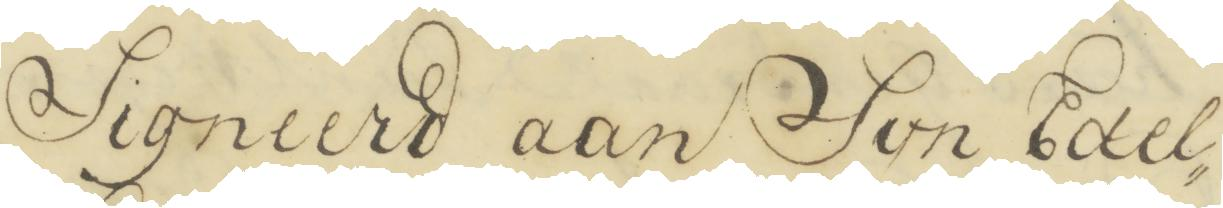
signeerd aan Syn Edel„
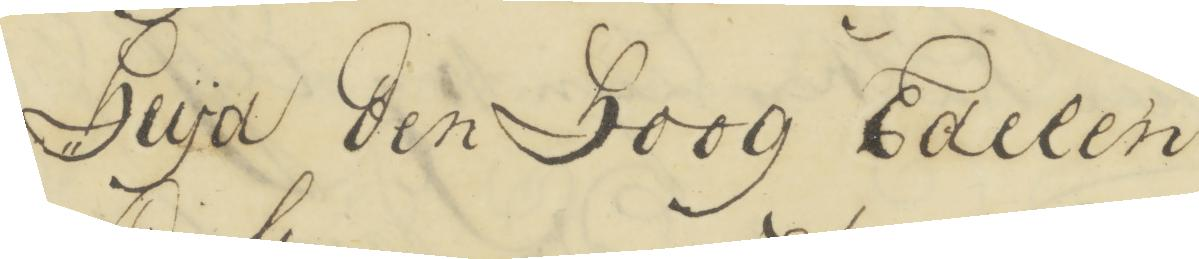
„heijd den hoog Edelen
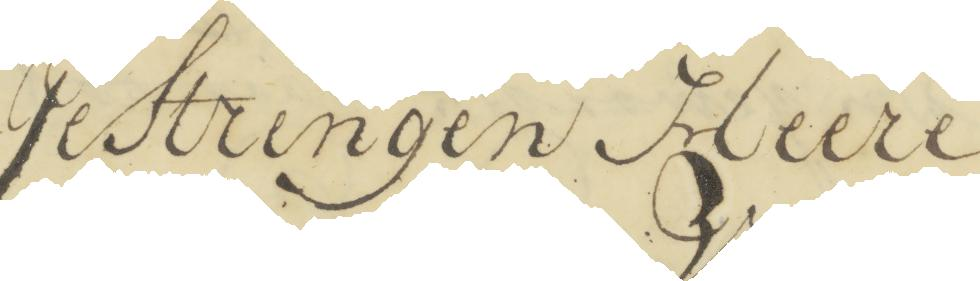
Gestrengen Heere
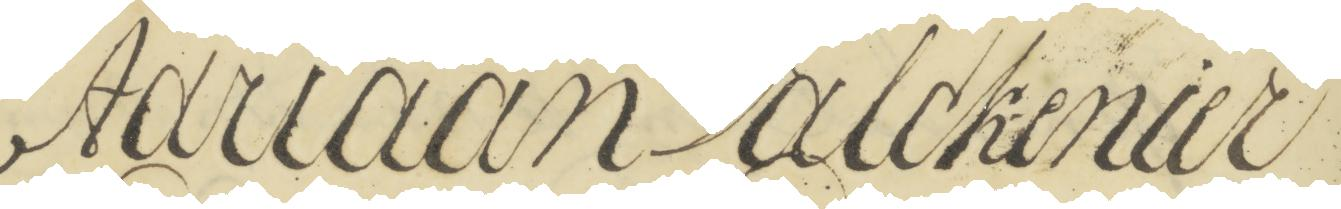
Adriaan Valckenier
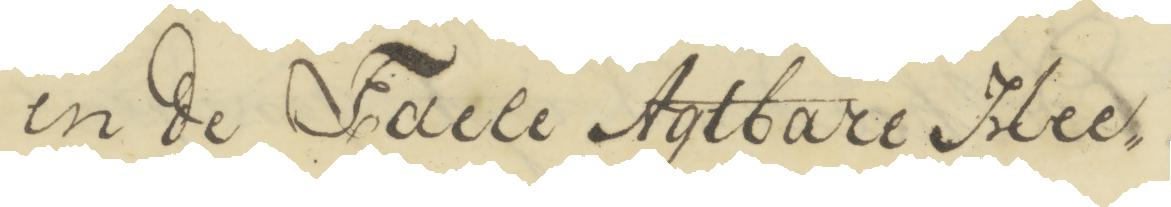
en de Edele Agtbare Hee„
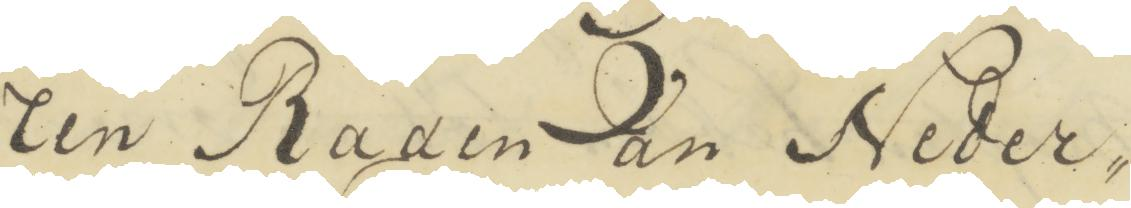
ren Raden Van Neder„
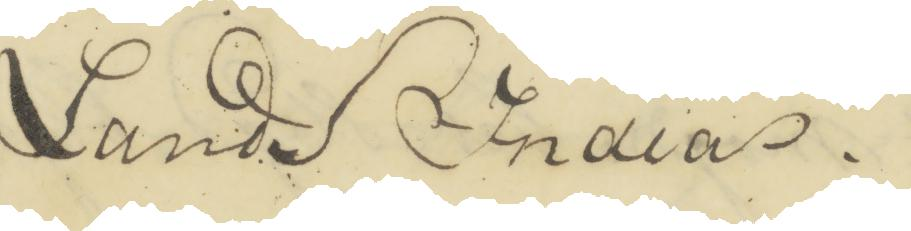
Lands India.
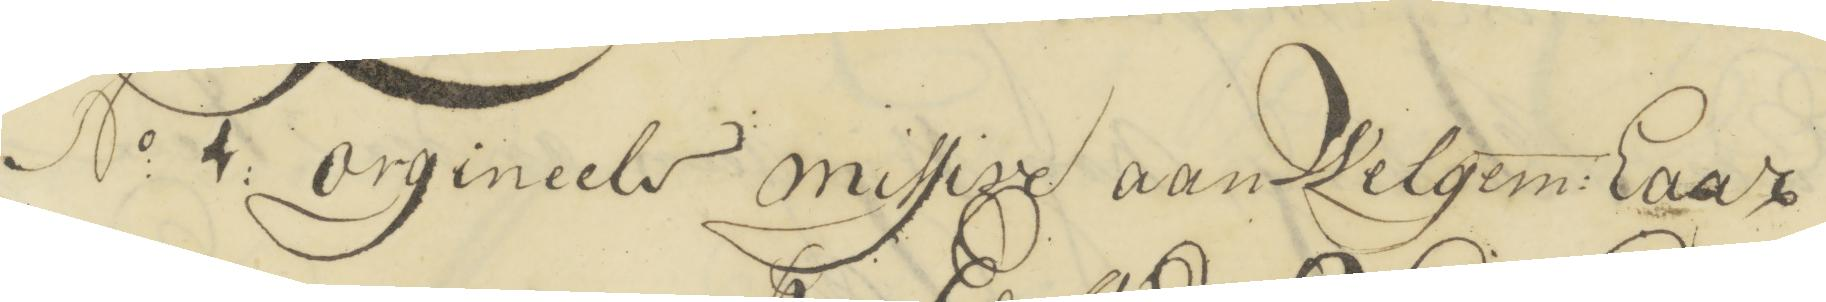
N:o 1: Orgineele missive aan Welgem: haar
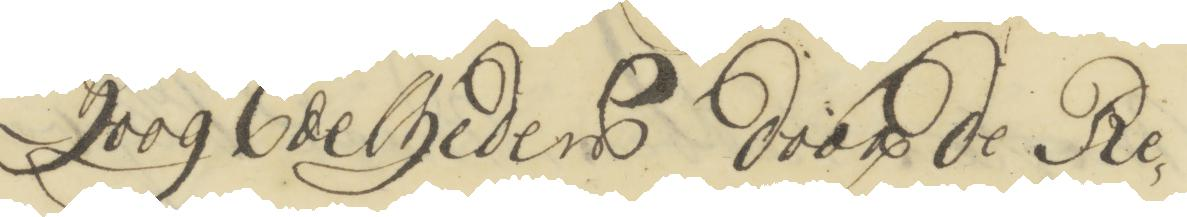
hoog Edelhedens door de Re„
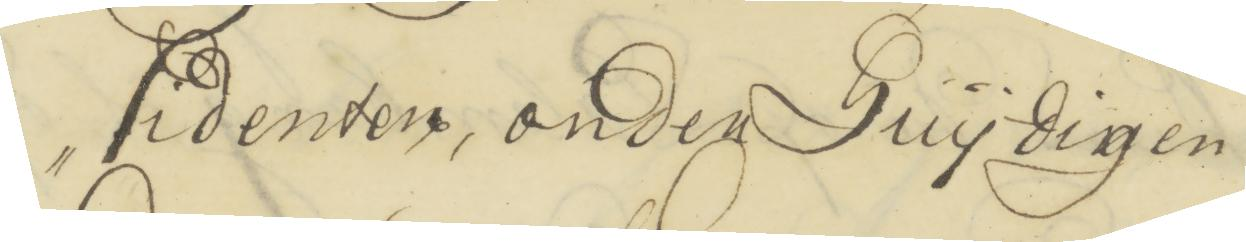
„sidenten, onder huijdigen
